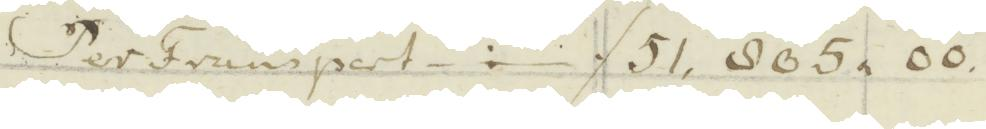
Per Transport - : — ƒ 51, 805 „00.
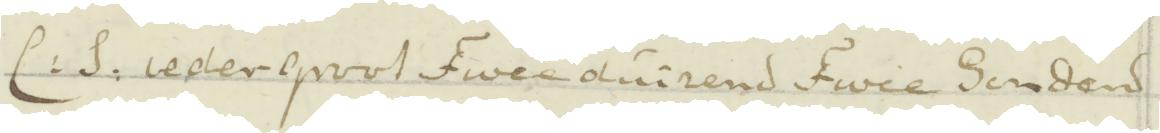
C:s: ieder Groot Twee duizend Twee honderd
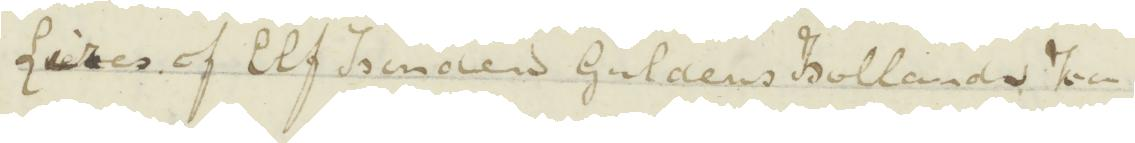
Lieres of Elf Honderd Guldens Hollands Ka
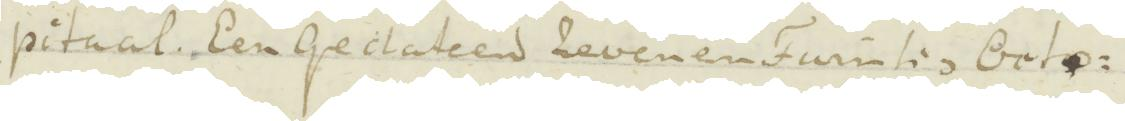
„pitaal. Een Gedateerd Zeven en Twintig Octo„
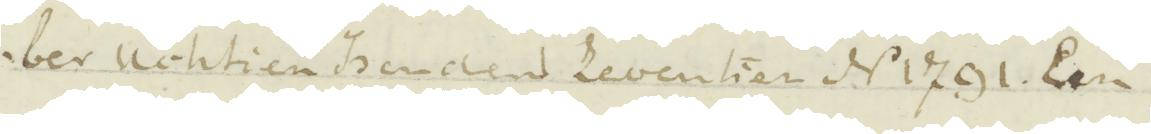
„ber Achtien Honderd Zeventien N 1791. Een
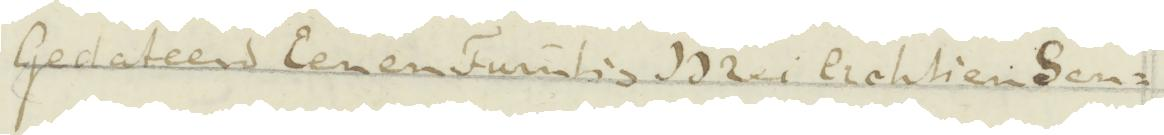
Gedateerd Een en Twintig Mei Achtien hon„
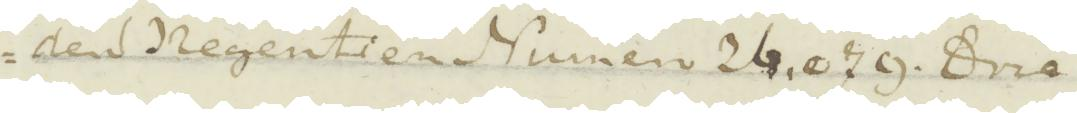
„derd Negentien Numero 24,079. Drie
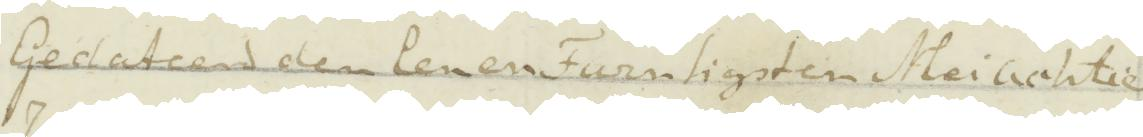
Gedateerd den Een en Twintigsten Mei Achtien
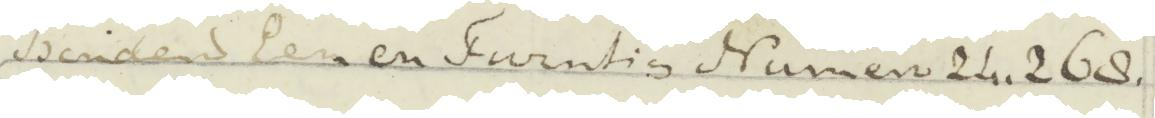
Honderd Een en Twintig Numero 24,268,
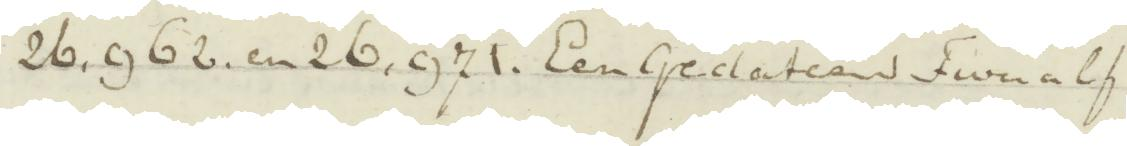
26,962, en 26,971. Een Gedateerd Twaalf
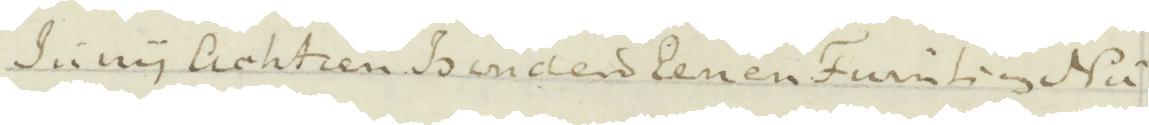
Iunij Achtien Honderd Een en Twintig Nu
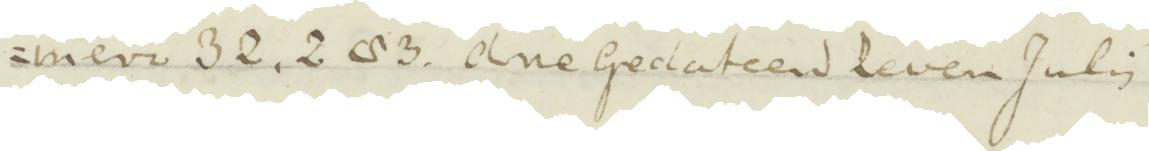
„mero 32,283. Drie Gedateerd Zeven Julij
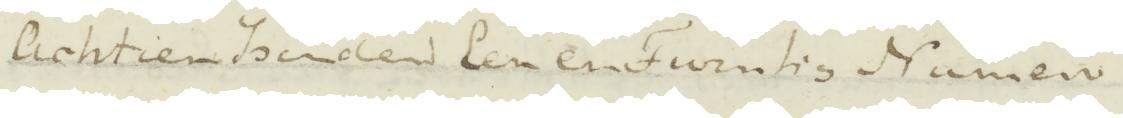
Achtien Honderd Een en Twintig Numero
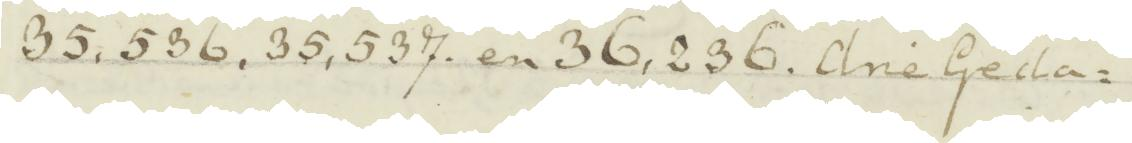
35,536, 35,537, en 36,236. Drie Geda„
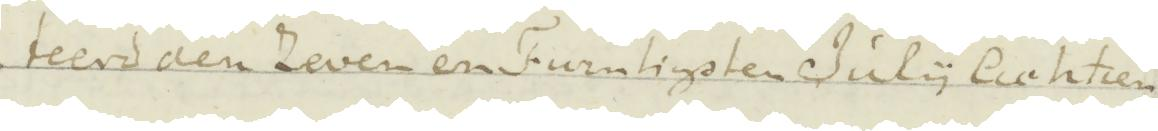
„teerd den Zeven en Twintigsten Iulij Achtien
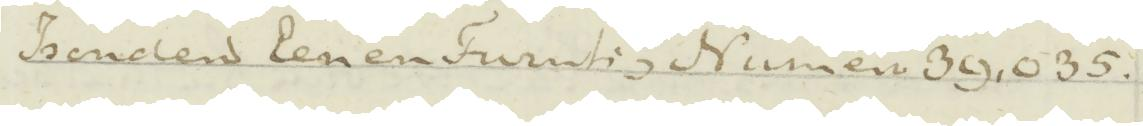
Honderd Een en Twintig Numero 39,035,
